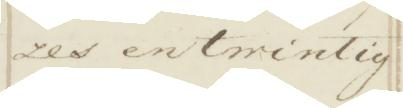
zes en twintig
